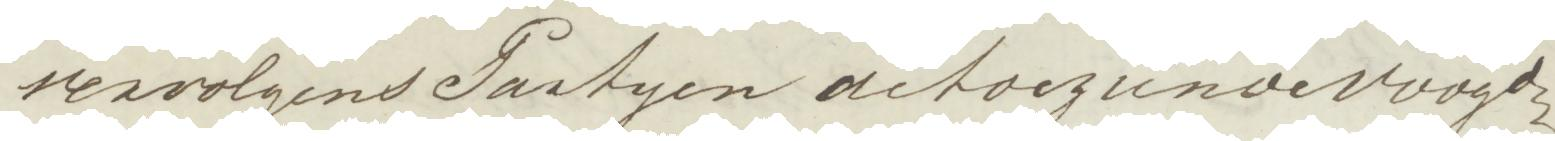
vervolgens Partyen de toeziende Voogden
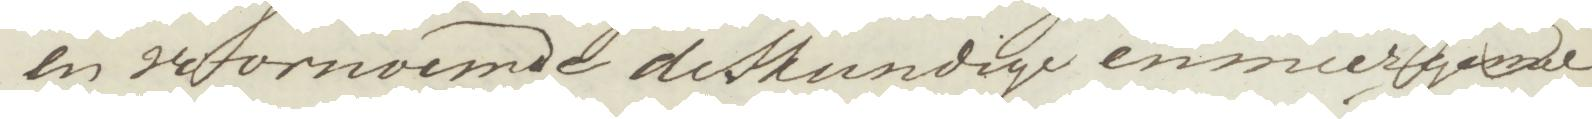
en voornoemde deskundige en meergemel
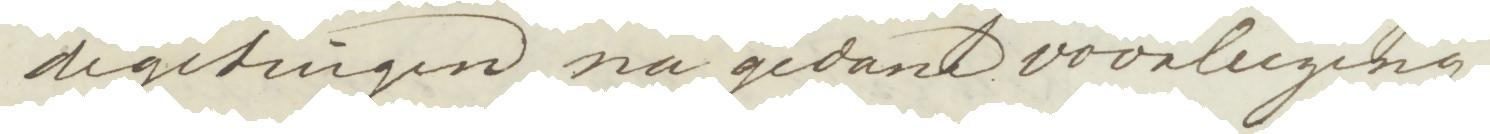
de getuigen na gedane voorleezing
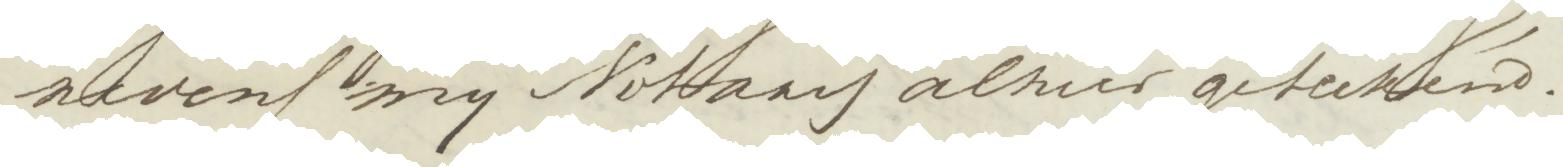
nevens my Notaris alhier geteekend.
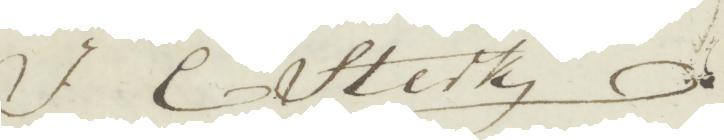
J C Sterk
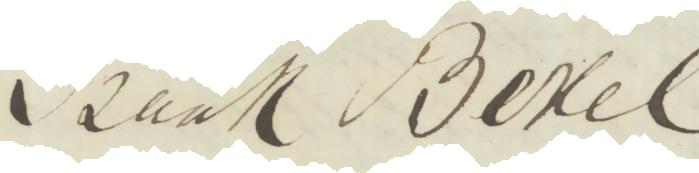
Izaak Bevel
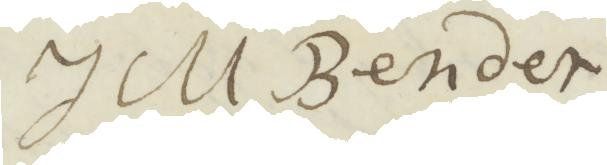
J M Bender
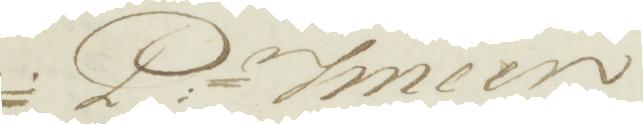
=P:= Smeer
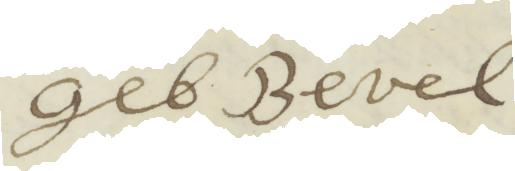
geb Bevel
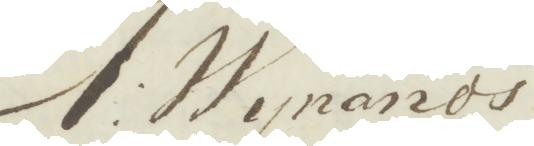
A: Wynands
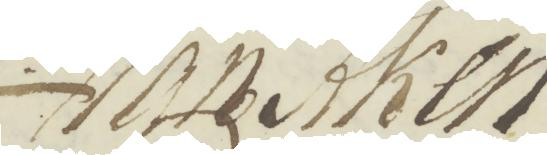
Cs Van Aken
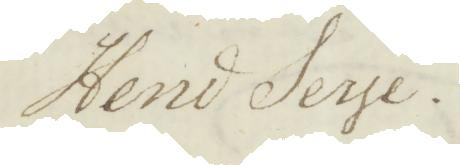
Hend Seye.
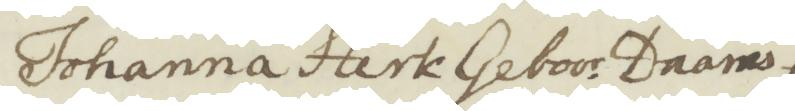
Johanna Sterk Geboor. Daams
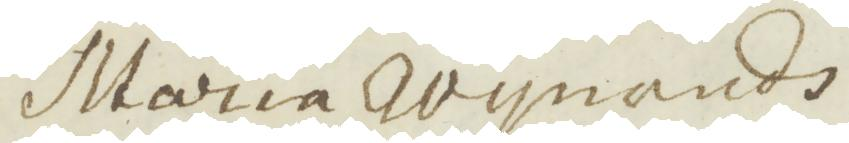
Maria Wynands
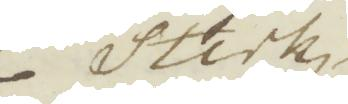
J. C Sterk
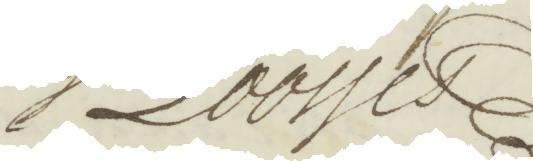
V-t Looyes
